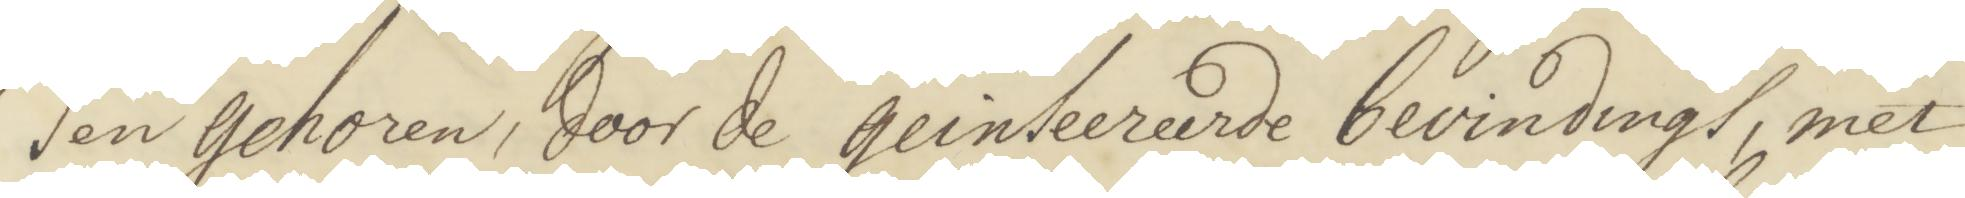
sen gehoren, door de geinseereerde bevindings, met
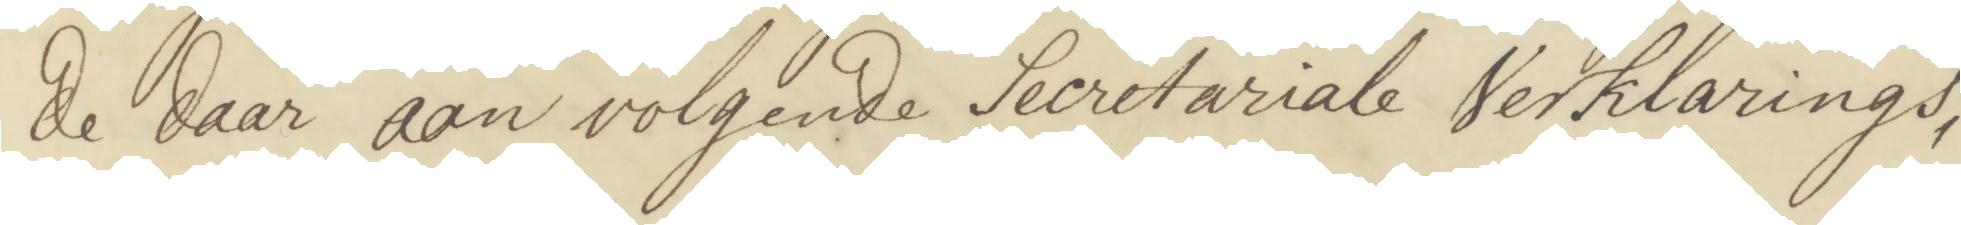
de daar aan volgende secretariale Verklarings,
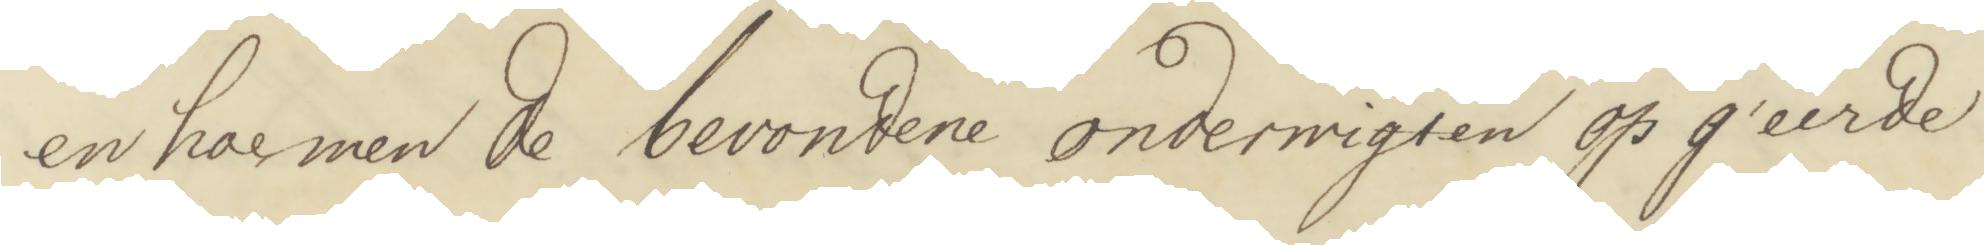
en hoe men de bevondene onderwigten op g’eerde
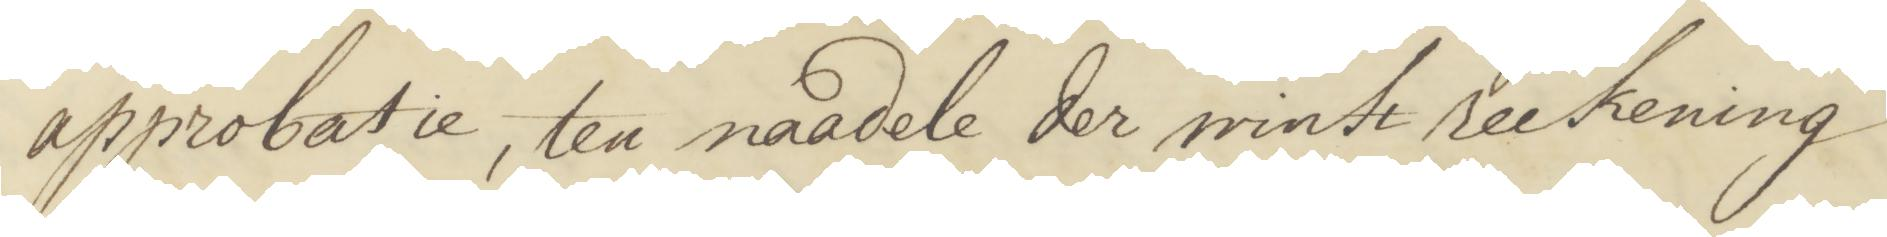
approbatie, ten naadele der winst reekening
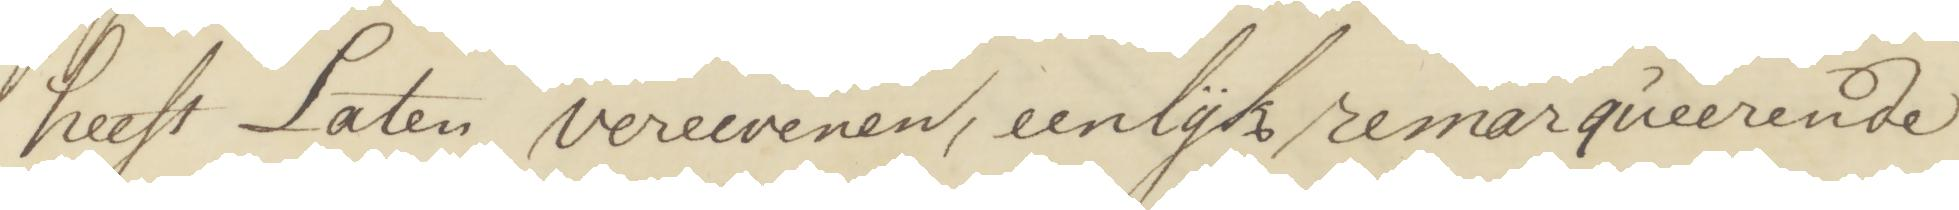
heeft Laten vereevenen, eenlijk remarqueerende
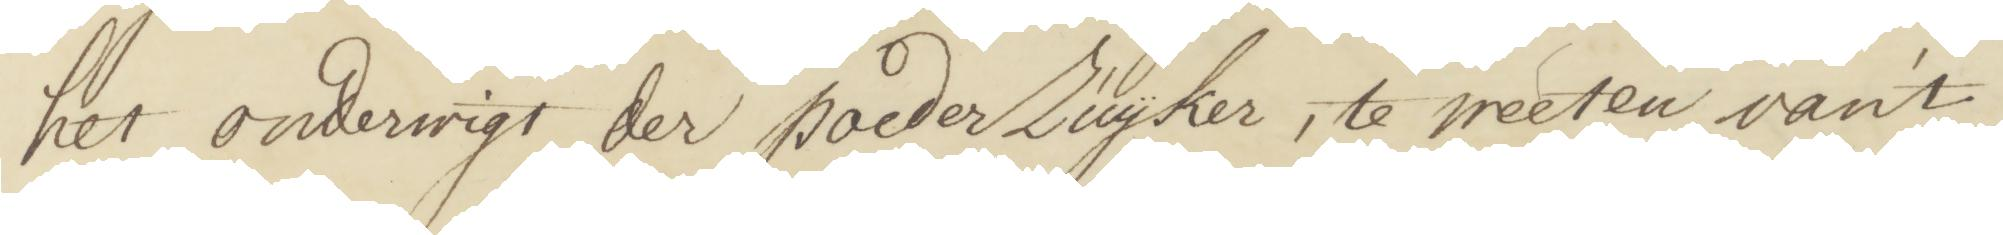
het onderwigt der poederzuijker, te weeten van’t
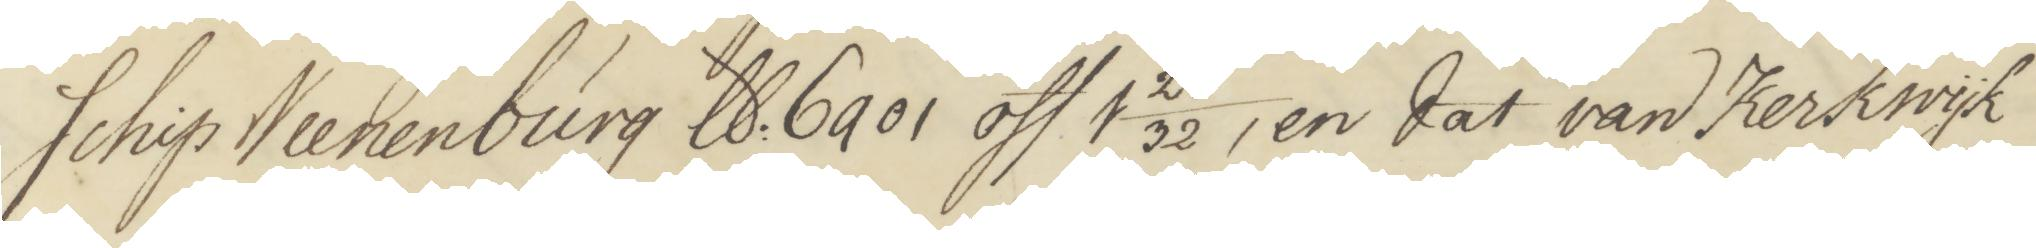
Schip Veenenburg lb: 6401 off 1 23/32, en dat van Kerkwijk
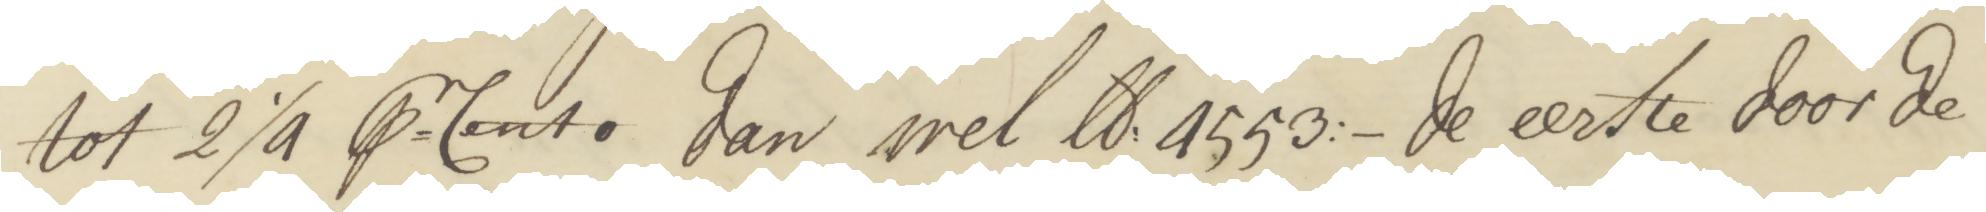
tot 2¼ p=rCento dan wel lb: 4553: — de eerste door de
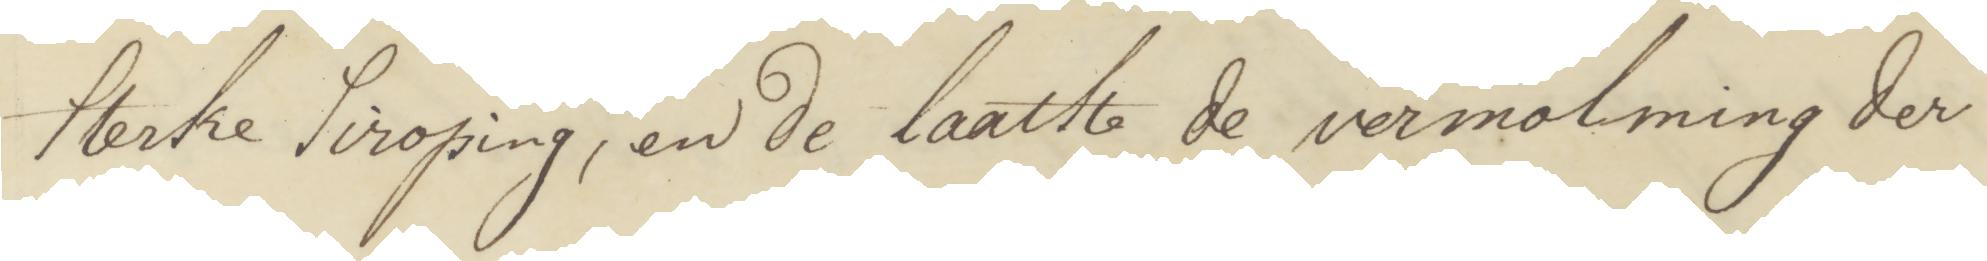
sterke siroping, en de laatste de vermolming der
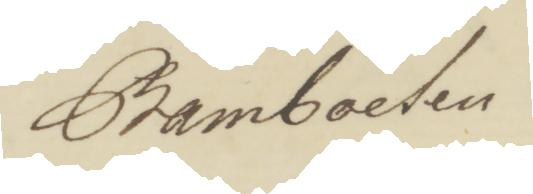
Bamboesen
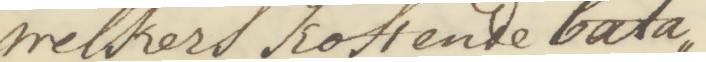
welkers kostende bata„
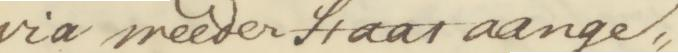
via weeder staat aange„
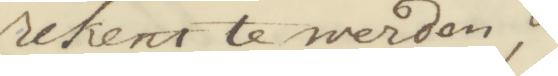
rekent te werden,
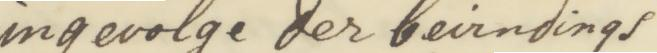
ingevolge der bevindings
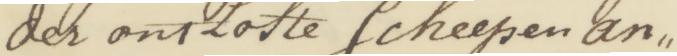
der ontloste scheepen an„
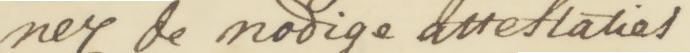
nex de nodige attestaties
